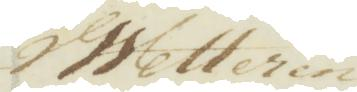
VWetteren
